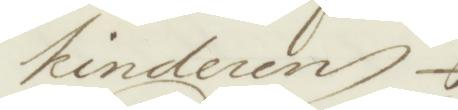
kinderen -
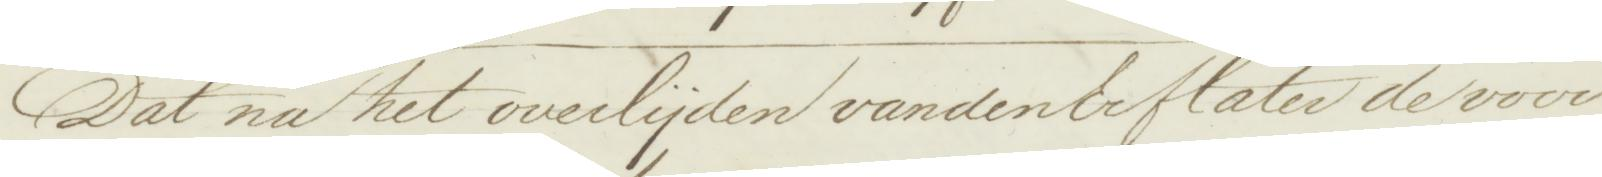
Dat na het overlijden van den Erflater de voor
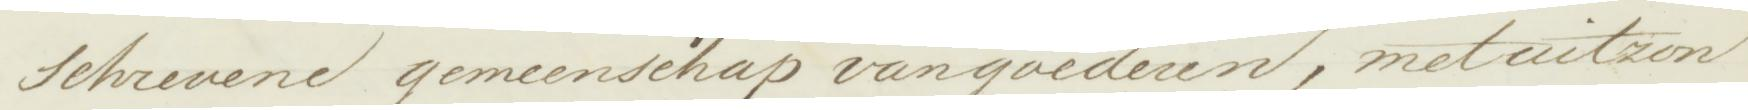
schrevene gemeenschap van goederen, met uitzon
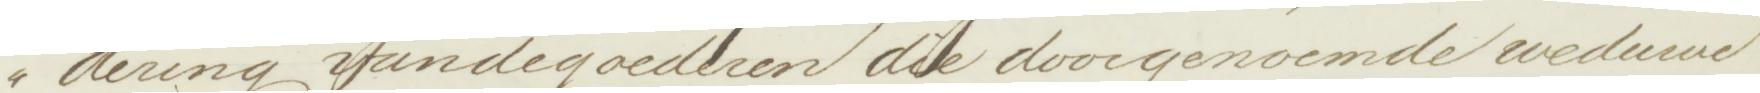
„dering van de goederen die doorgenoemde weduwe
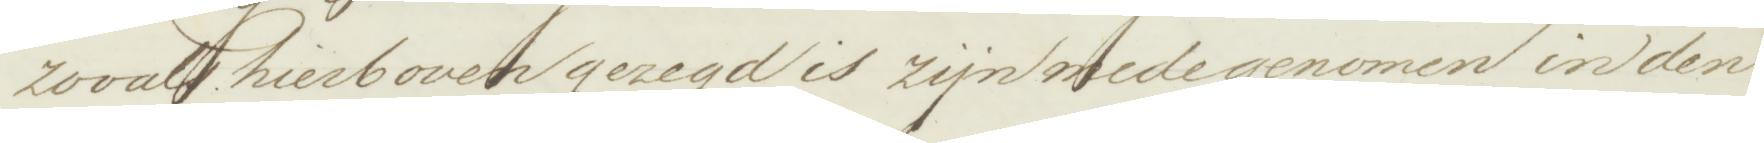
zooals hierboven gezegd is zijn medegenomen in den
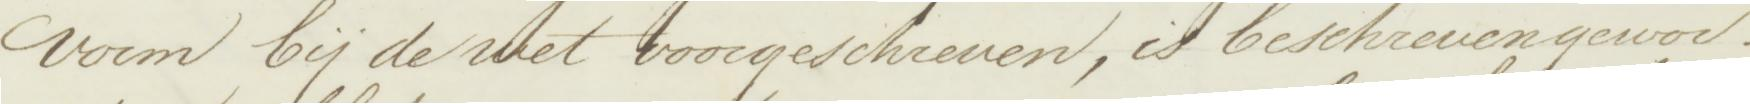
vorm bij de wet voorgeschreven, is beschreven gewor
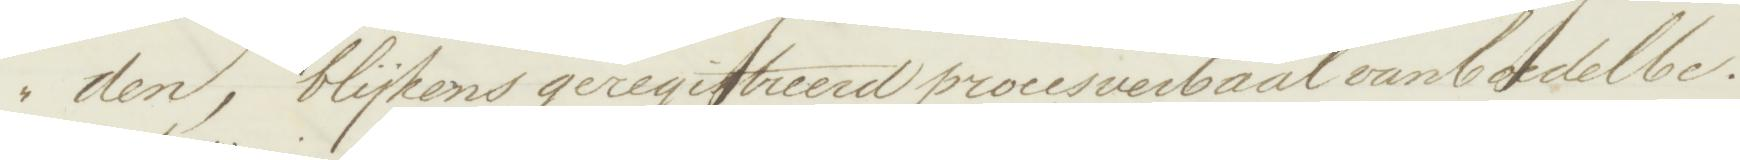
„ den, blijkens geregistreerd procesverbaal van boedelbe
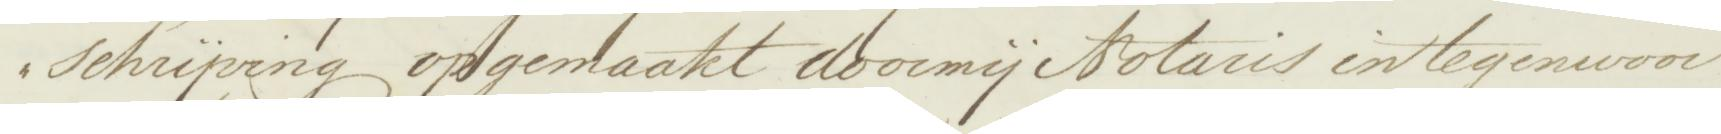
„ schrijving opgemaakt door mij Notaris in tegenwoor
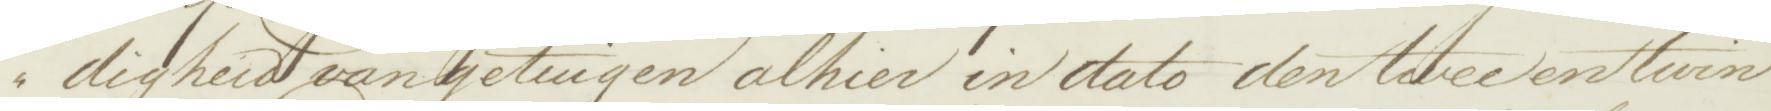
„ digheid van getuigen alhier in dato den twee en twin
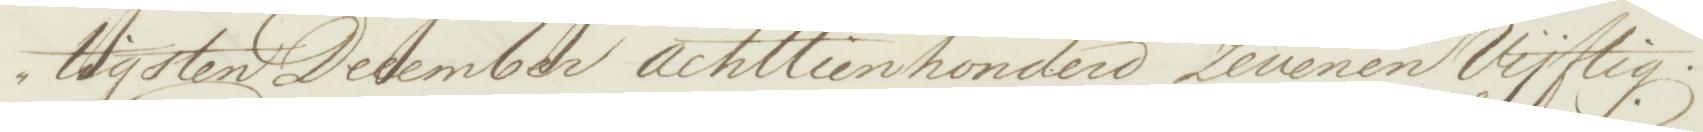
„ tigsten December achttienhonderd zevenen Vijftig.
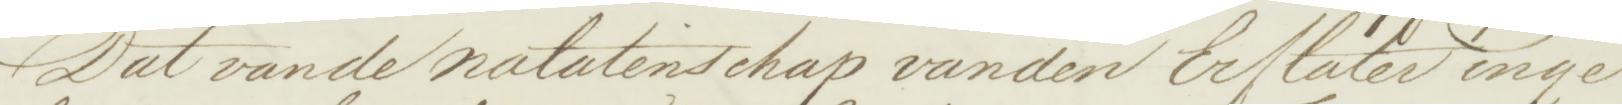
Dat van de nalatenschap van den Erflater inge
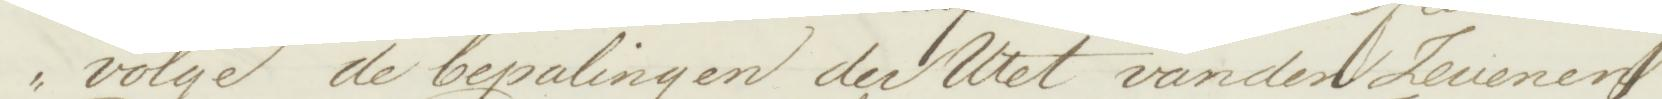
„ volge de bepalingen der Wet van den Zevenen
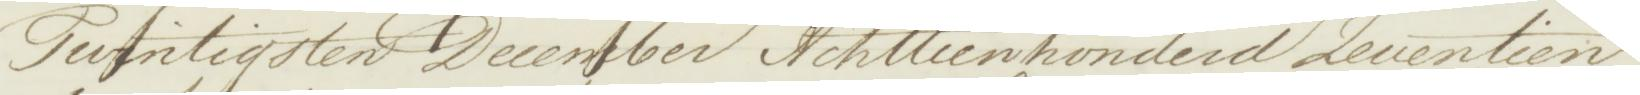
Twintigsten December Achttienhonderd Zeventien
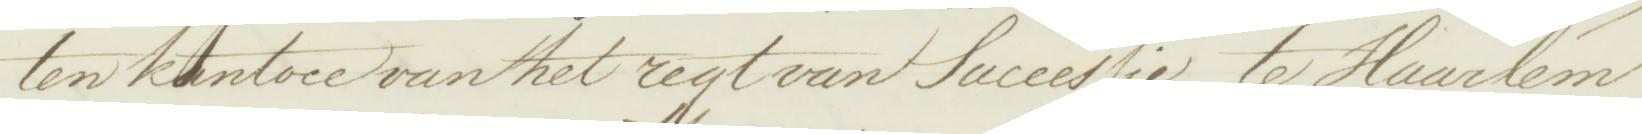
ten kantore van het regt van Successie te Haarlem
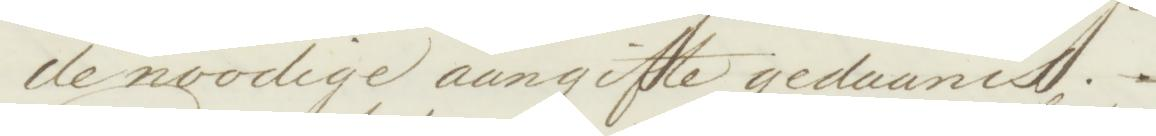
de noodige aangifte gedaanis.-
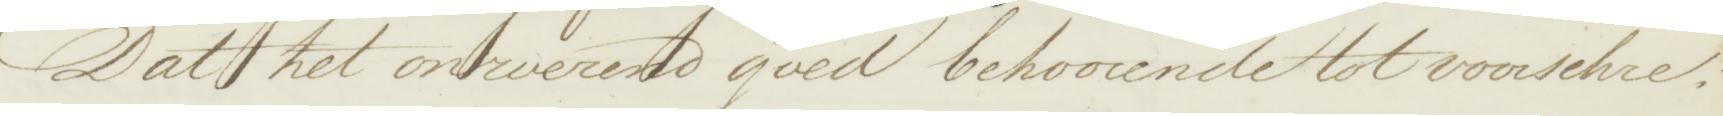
Dat het onroerend goed behoorende tot voorschre,
